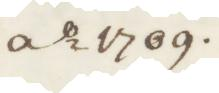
a=o 1709
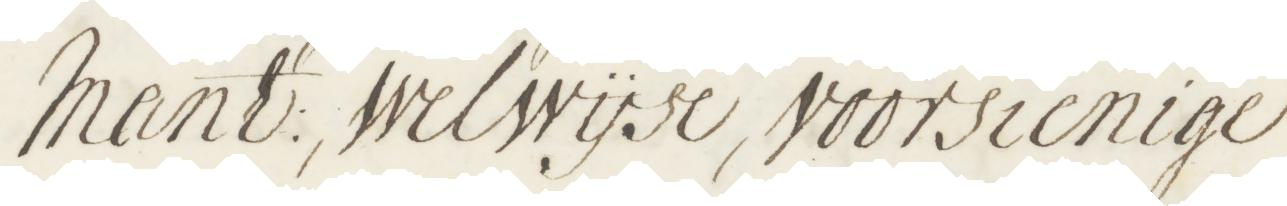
Manh:, welwijse, voorsienige
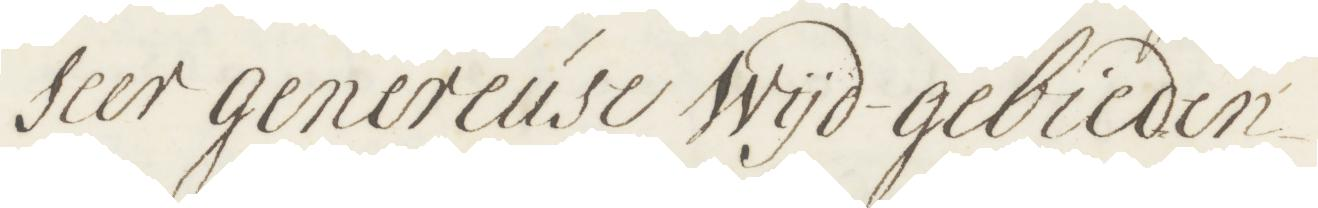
seer genereuse wijd gebieden
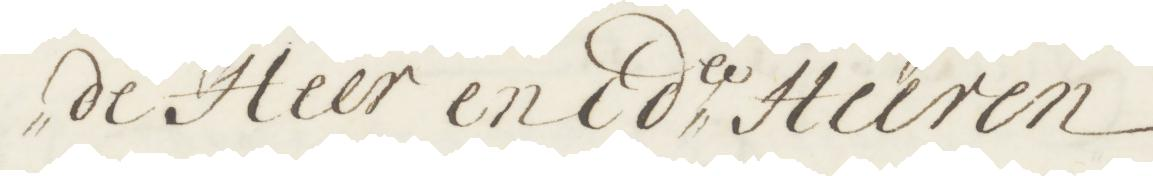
„de Heer en Ed„le Heeren
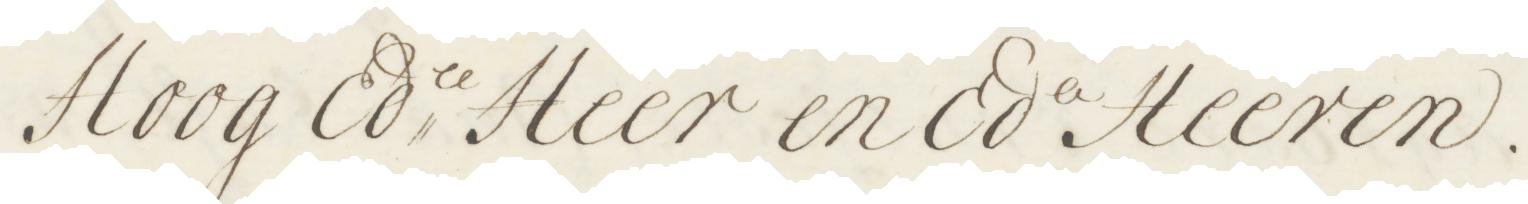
Hoog Ed„le Heer en Edle Heeren.
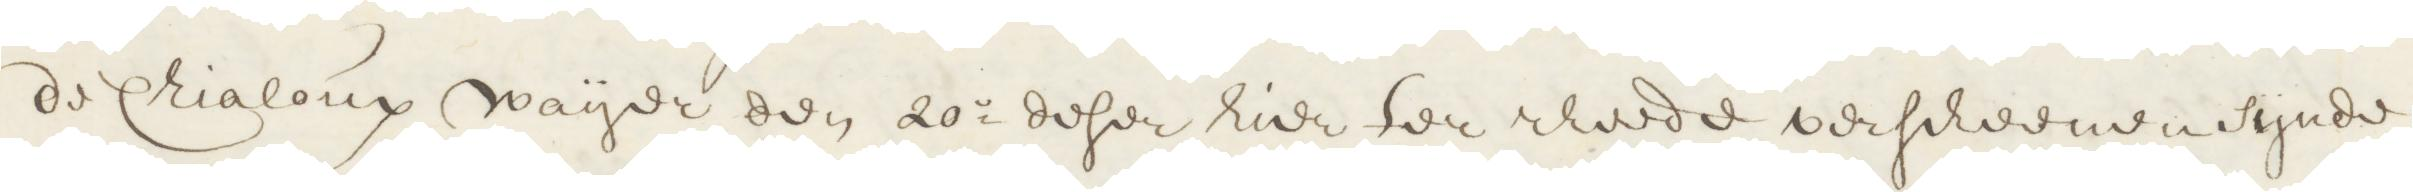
de Chialoup waijer den 20=' deser hier ter rheede verscheenen sijnde
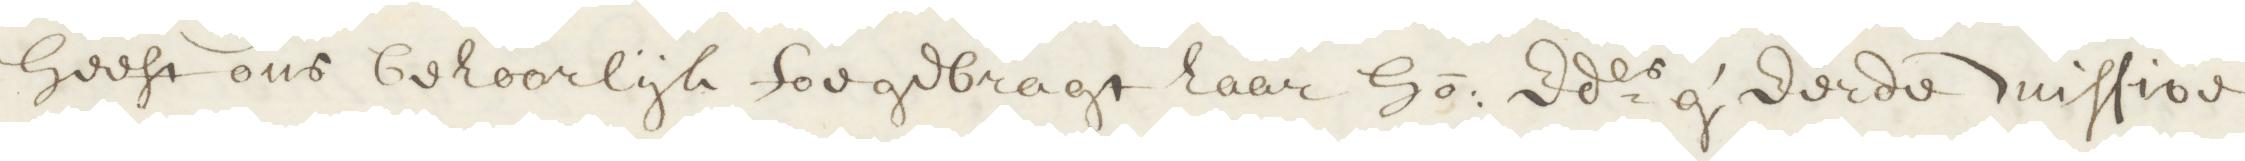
heeft ons behoorlijk toegebragt haar ho: Ed=ls g’Eerde missive
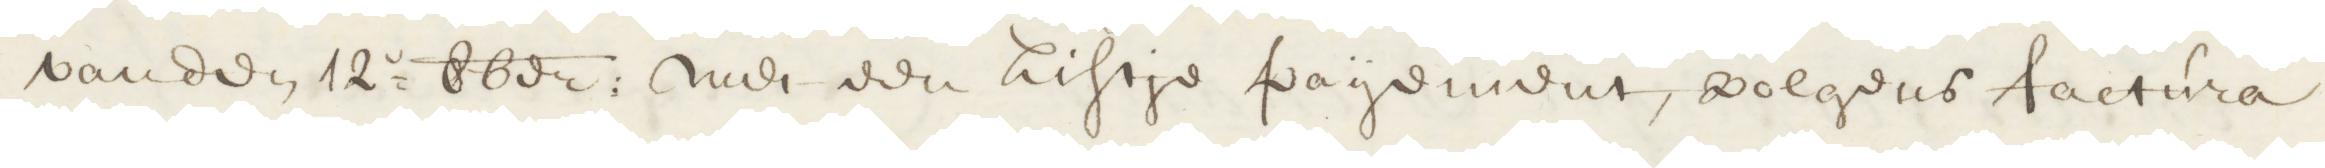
van den 12=' 8ber: met een kistje paijement, volgens factura
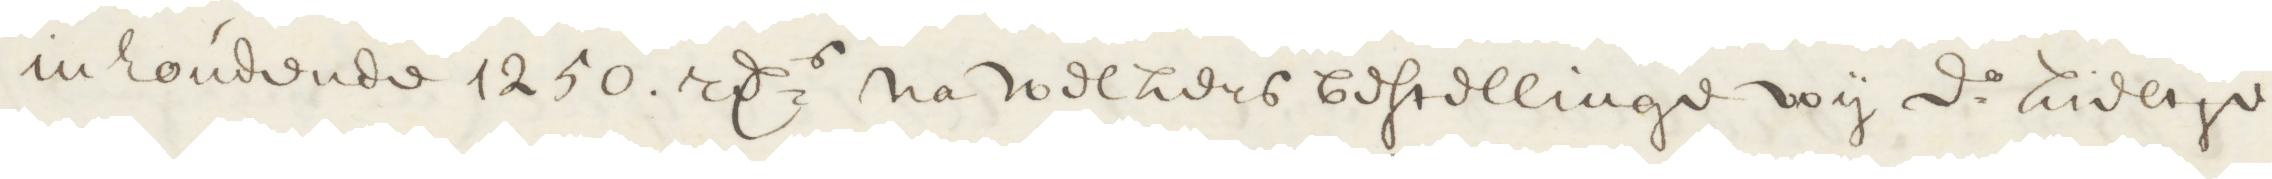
in houdende 1250. rd=s na welkers bestellinge wij d=o kieltje
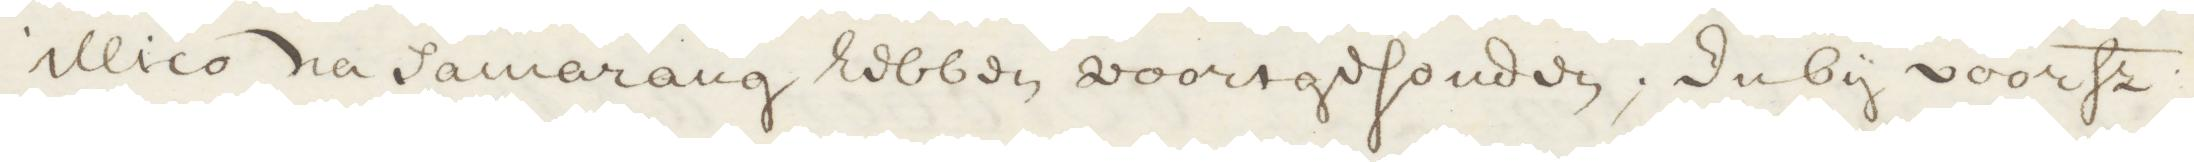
illico na samarang hebben voortgesonden; En bij voorsz:
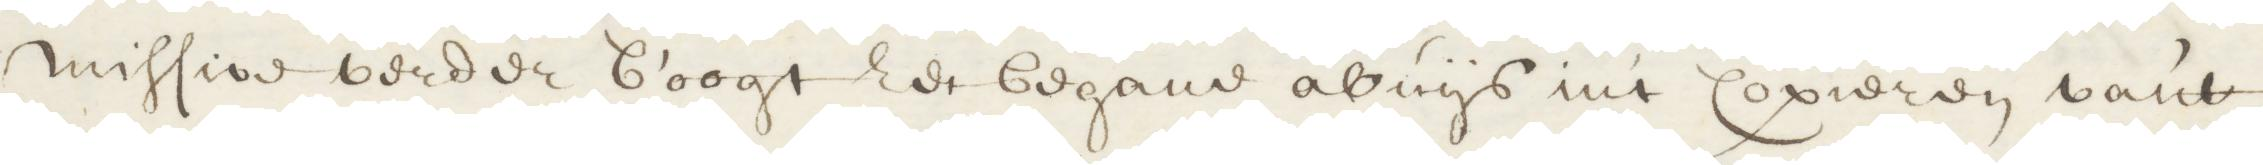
missive verder b'oogt het begane abuijs in’t Copieren van't
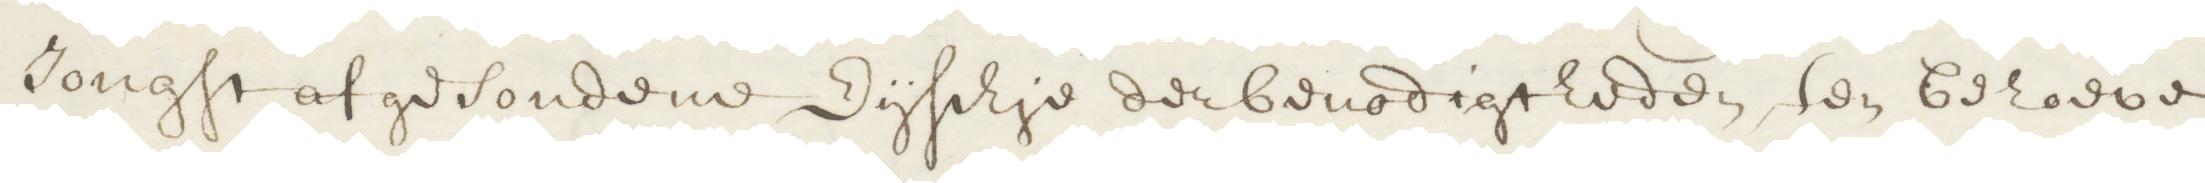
Iongst afgesondene Eijschje der benodigtheden, ten behoeve
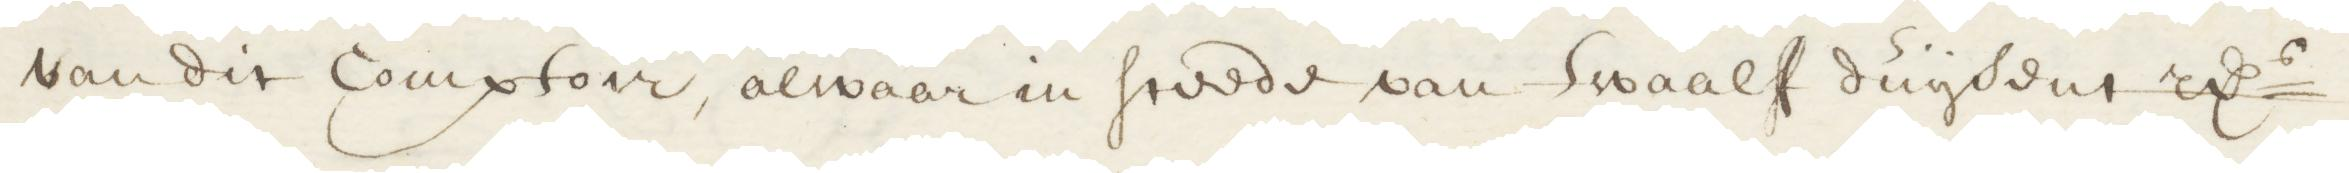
van dit Comptoir, alwaar in steede van twaalff duijsent rx=s
